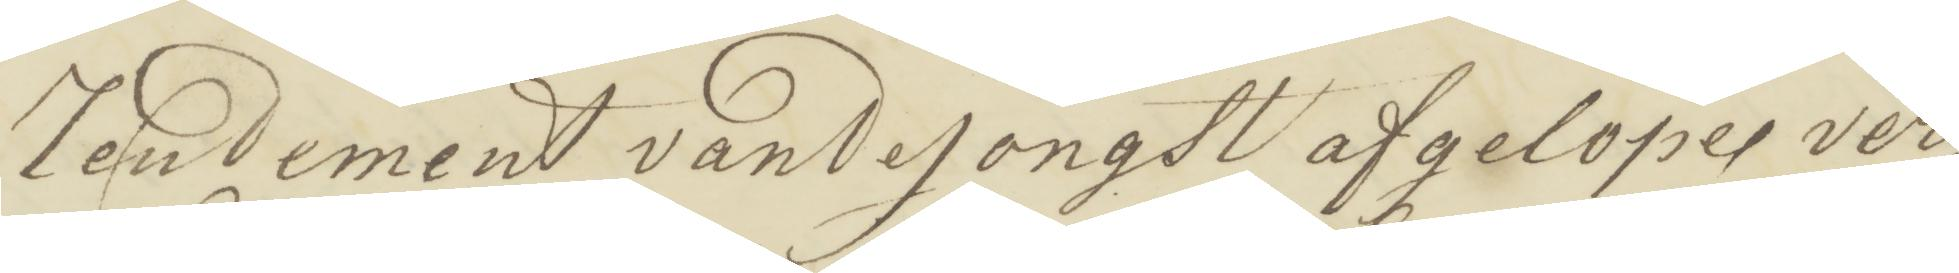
Rendement van de Jongst afgelopen ver
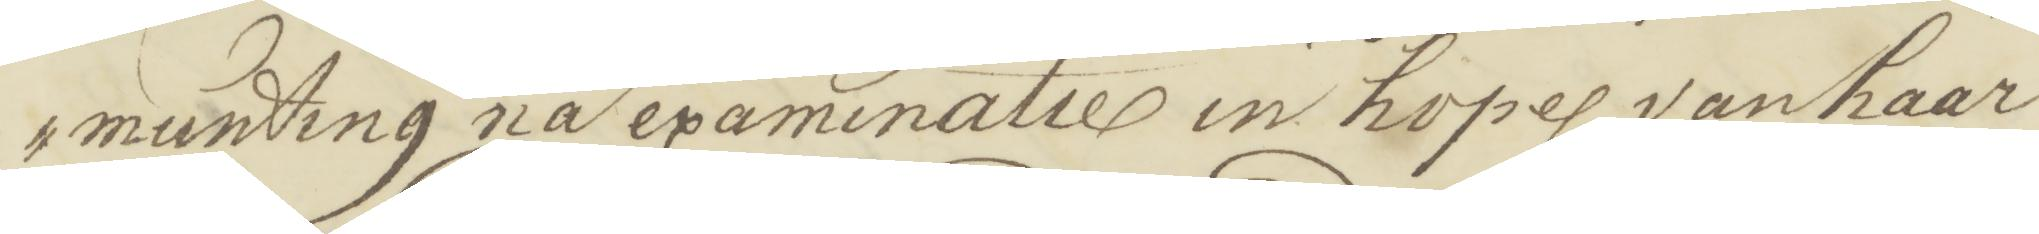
„munting na examinatie in hope van haar
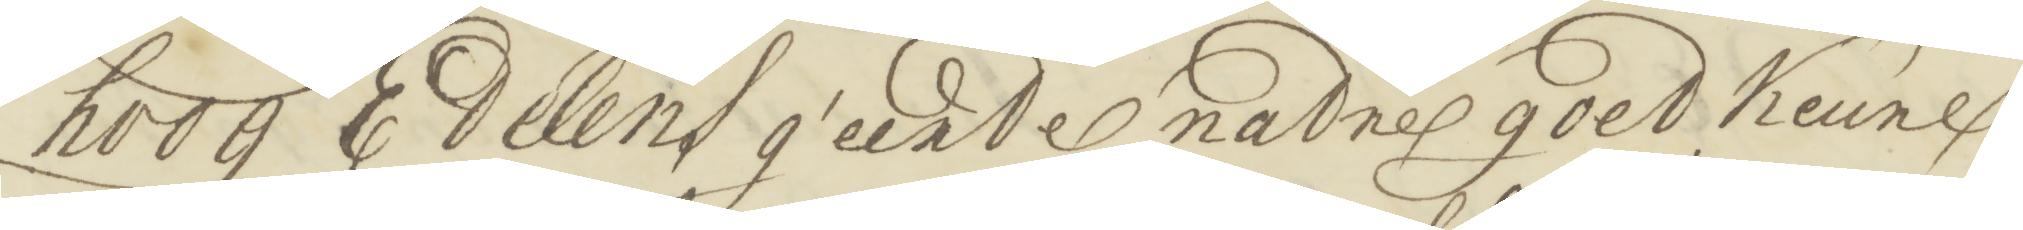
hoog Edelens g’eerde nadre goed Keure
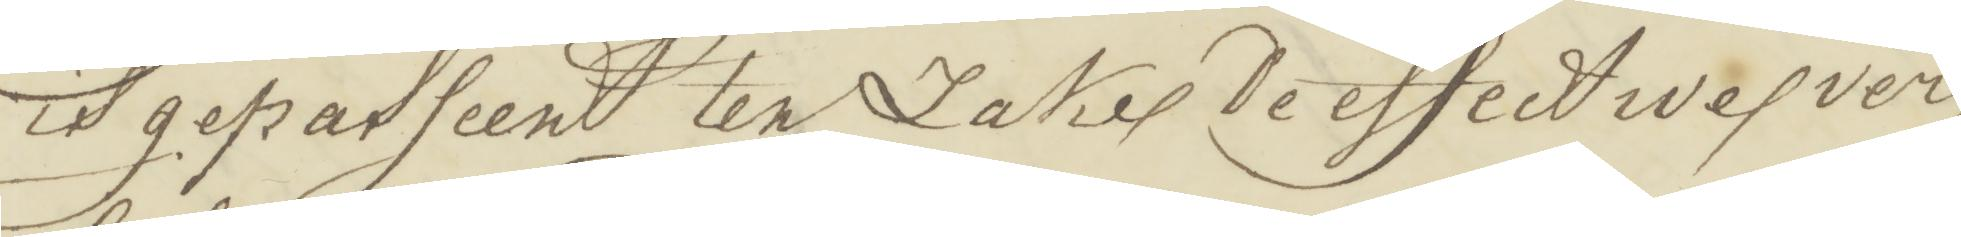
is gepasseerd ter Zake de effective ver
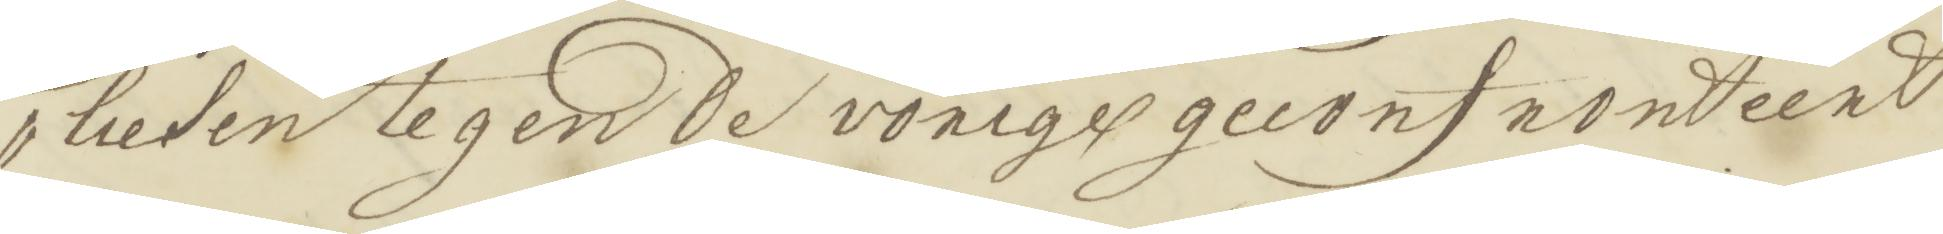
„liesen tegen de vorige geconfronteert
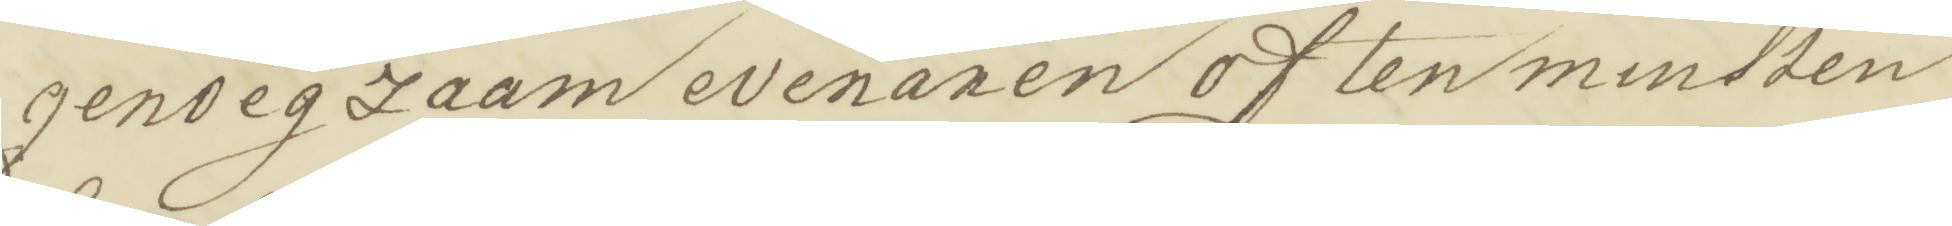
genoegzaam evenaren of ten minsten
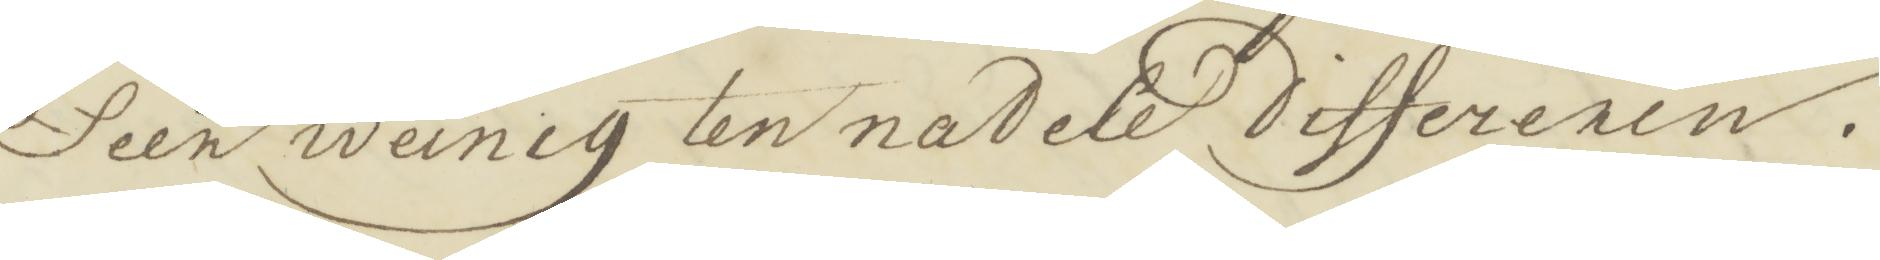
seer weinig ten nadele differeren.
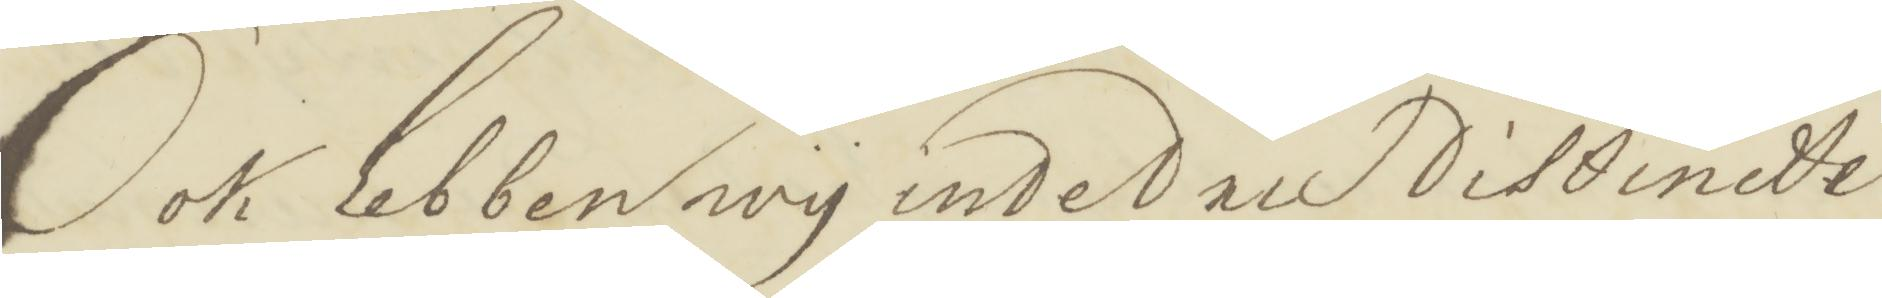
Ook hebben wij in de drie distincte
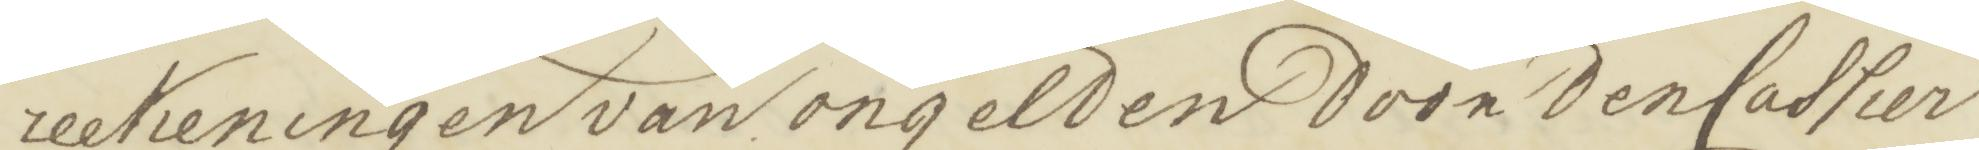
reekeningen van ongelden door den Cassier
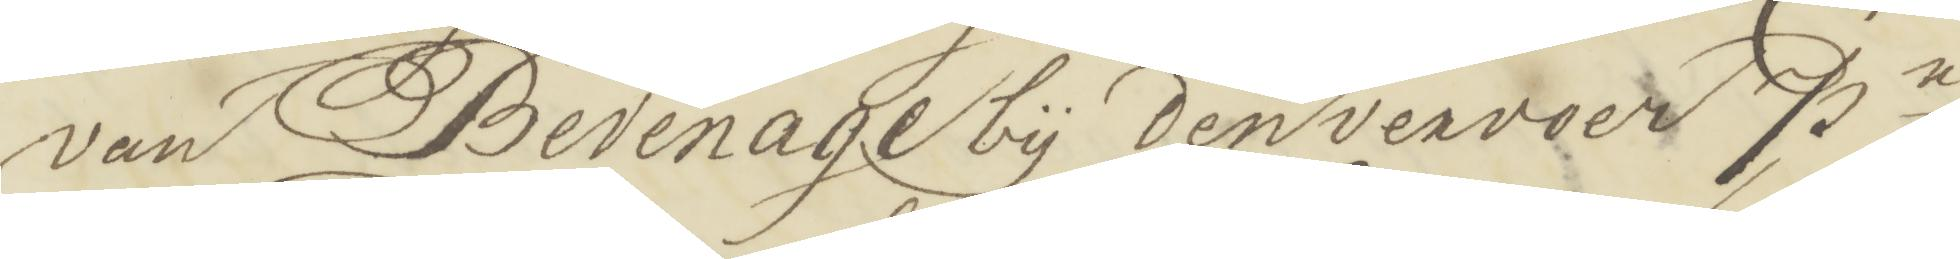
van Bevenage bij den vervoer p„r
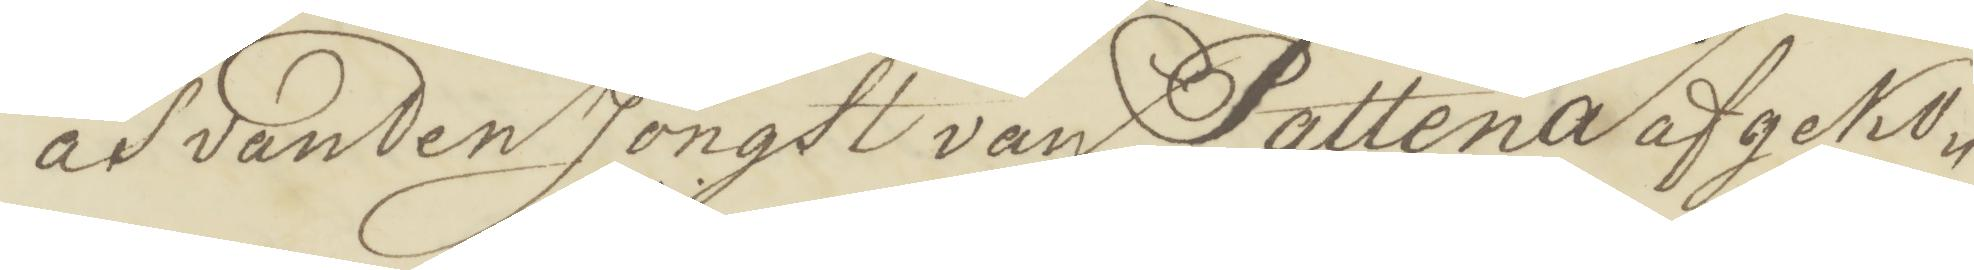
as van den Jongst van Pattena afgeko
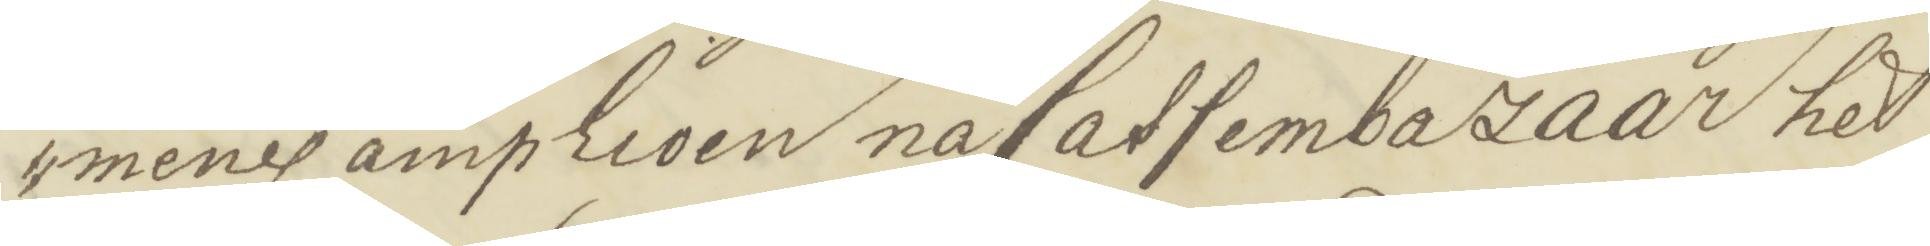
„mene amphioen na Cassembazaar het
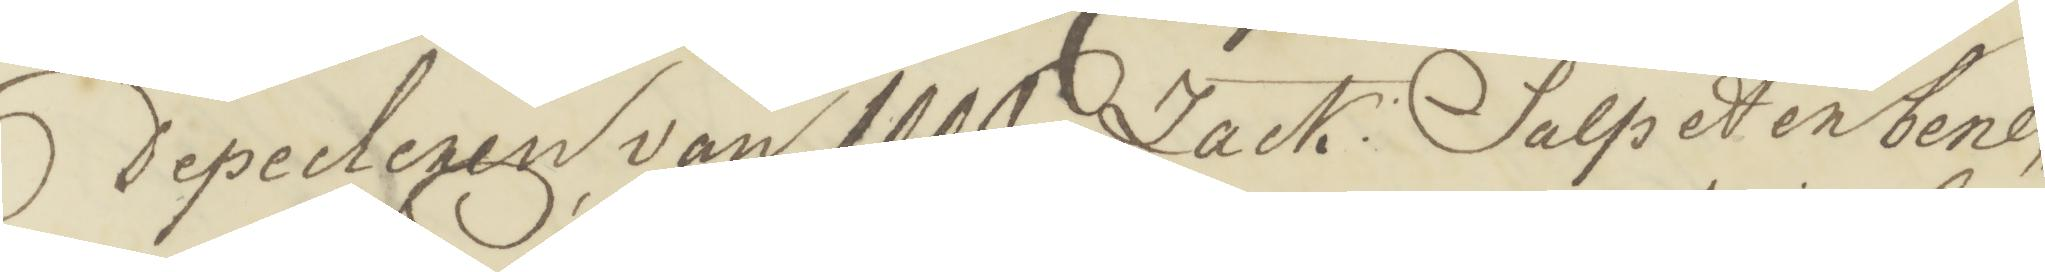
depecheren van 1005 Zack: Salpeter bene„
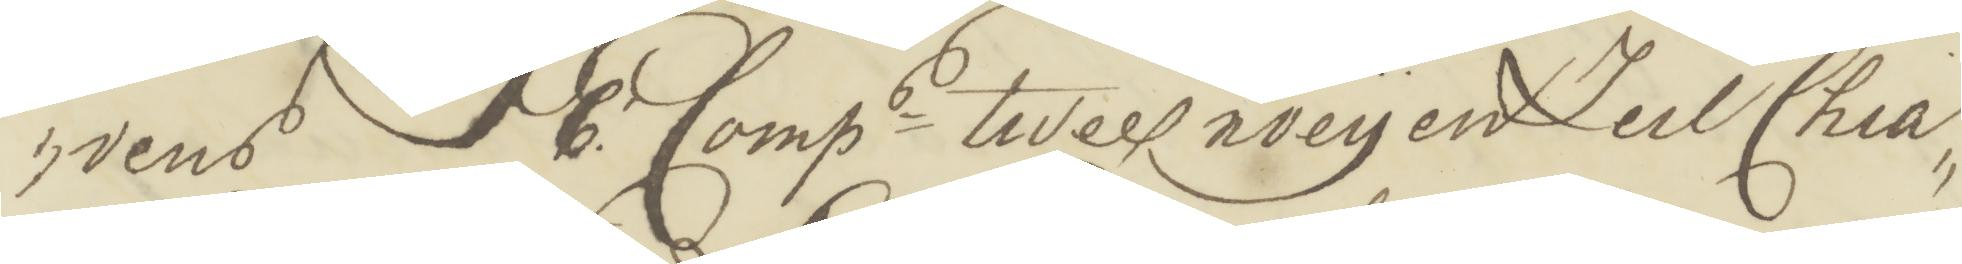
vens SE: Comp:s twee roeij en Zeil Chia„
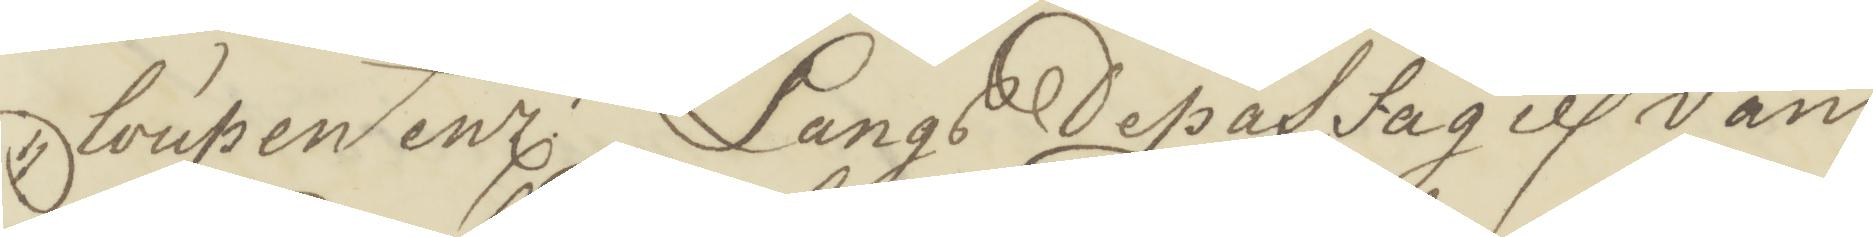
loupen enz: Langs de passagie van
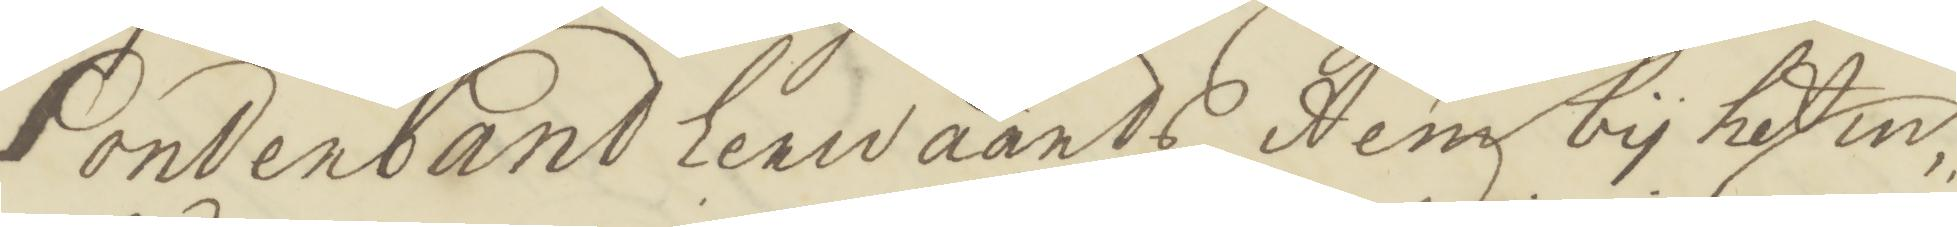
Sonderband herwaards item bij het in„
